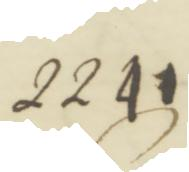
2241
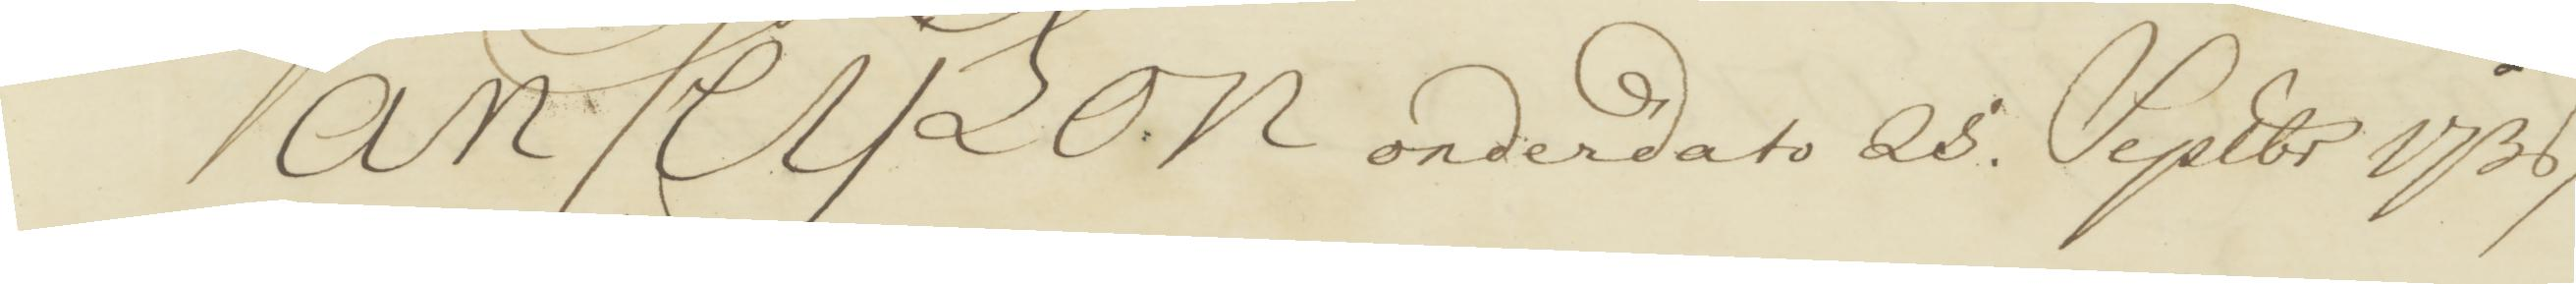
Van Ceijlon onderdato 25. 1736/
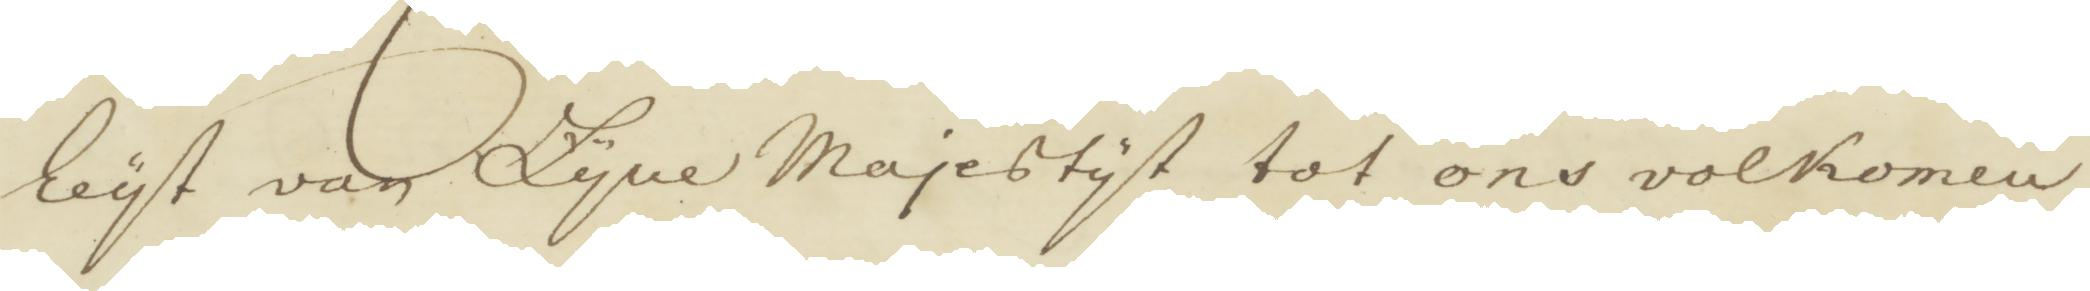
heijt van Zijne Majestijt tot ons volkomen
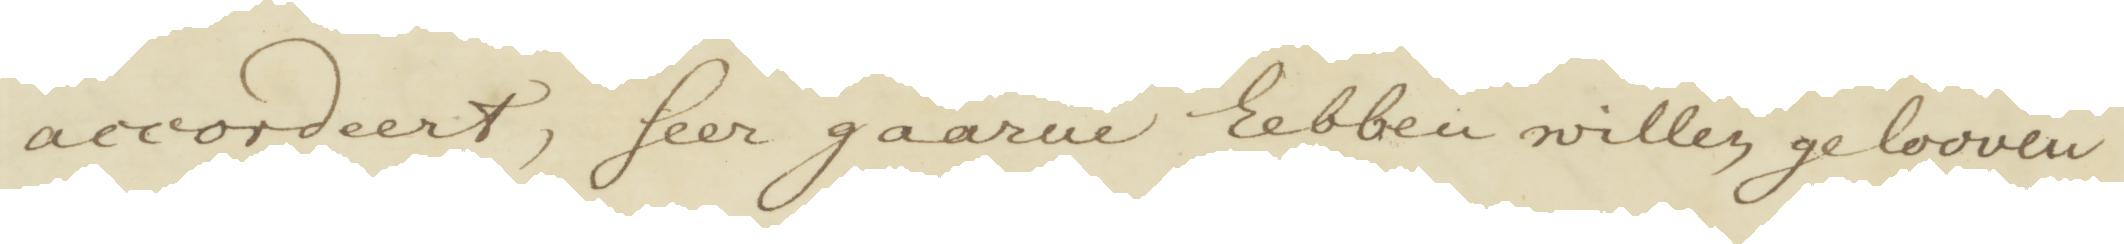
accordeert, seer gaarne hebben willen gelooven
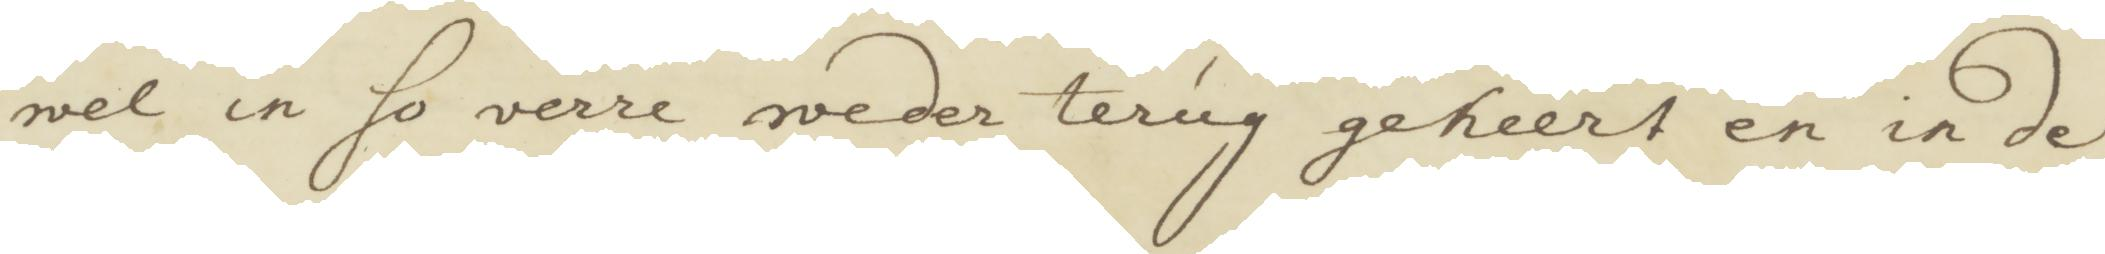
wel in so verre weder terug gekeert en in de
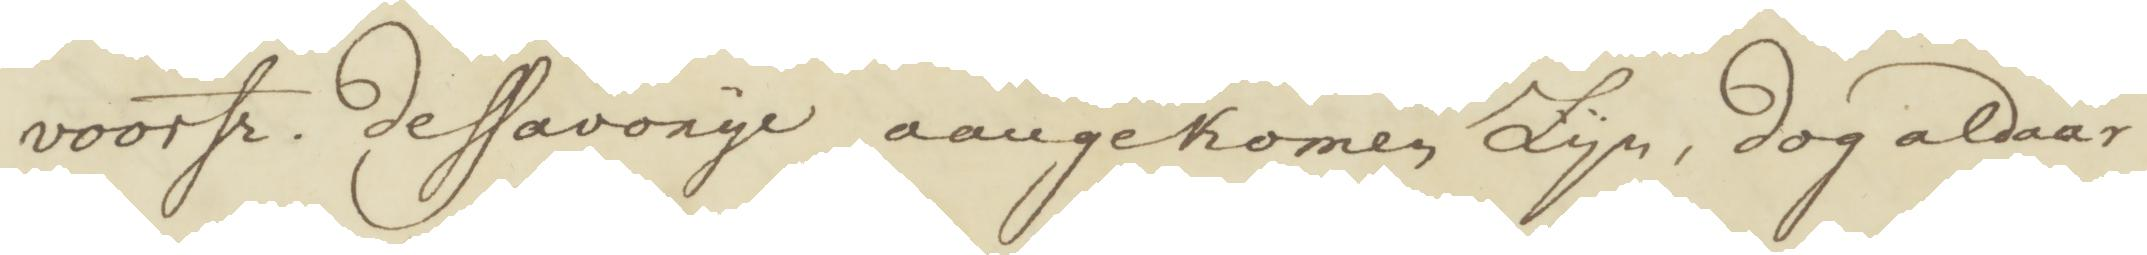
voorsr. dessavorije aangekomen zijn, dog aldaar
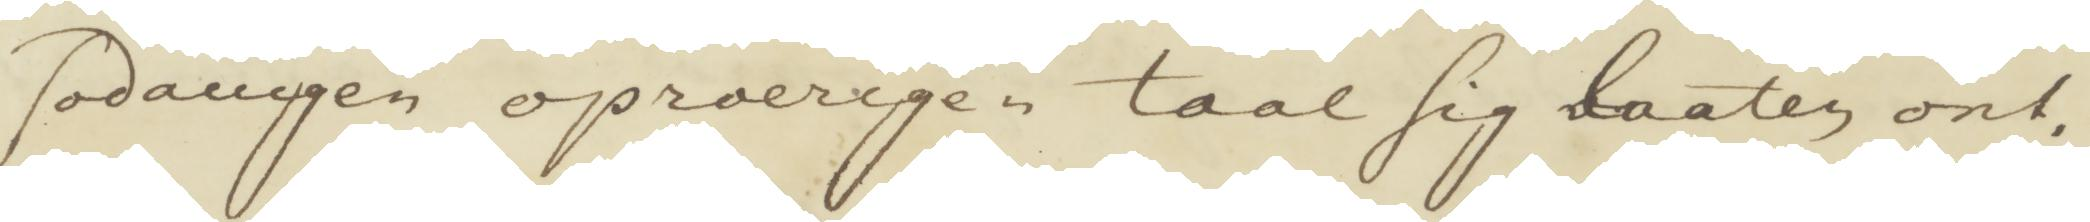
sodanigen oproerigen taal sig laaten ont.
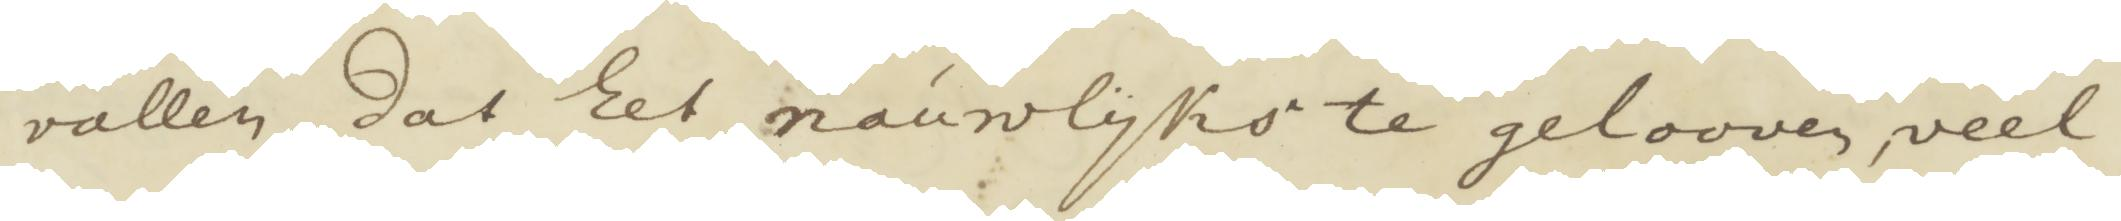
vallen, dat het nauwlijks te gelooven, veel
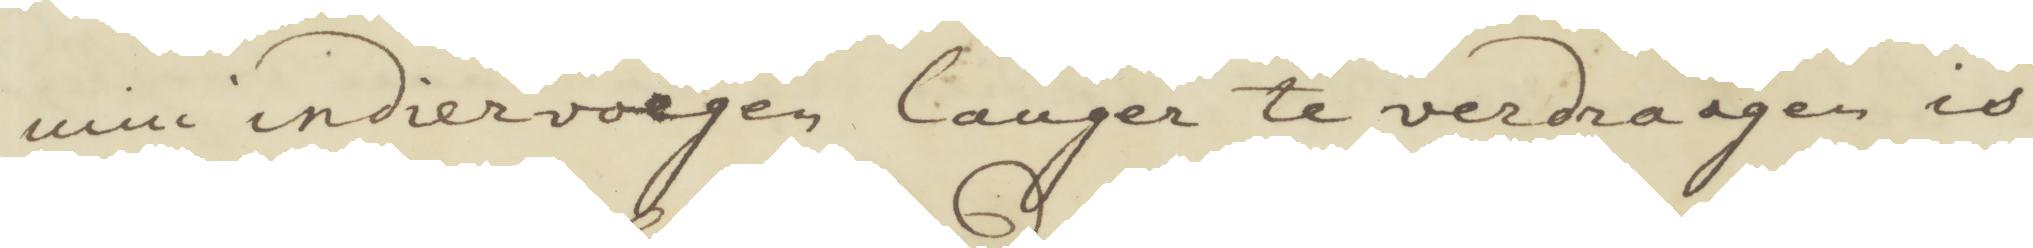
min indiervoegen langer te verdraagen is
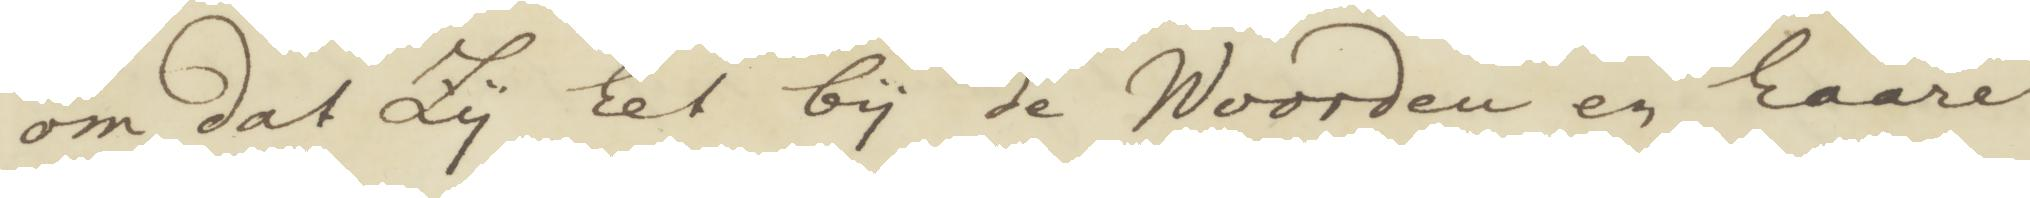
om dat zij het bij de woorden en haare
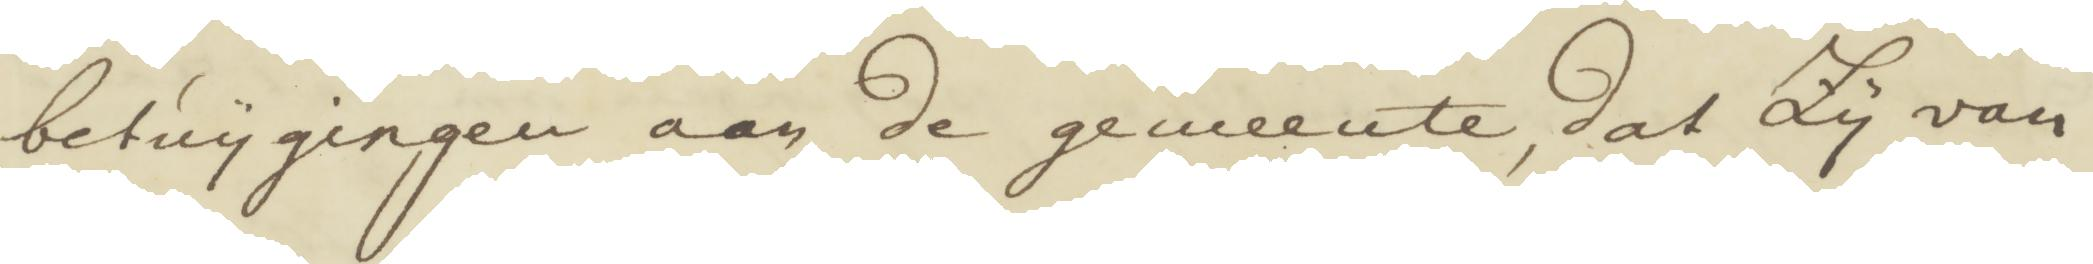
betuijgingen aan de gemeente, dat zij van
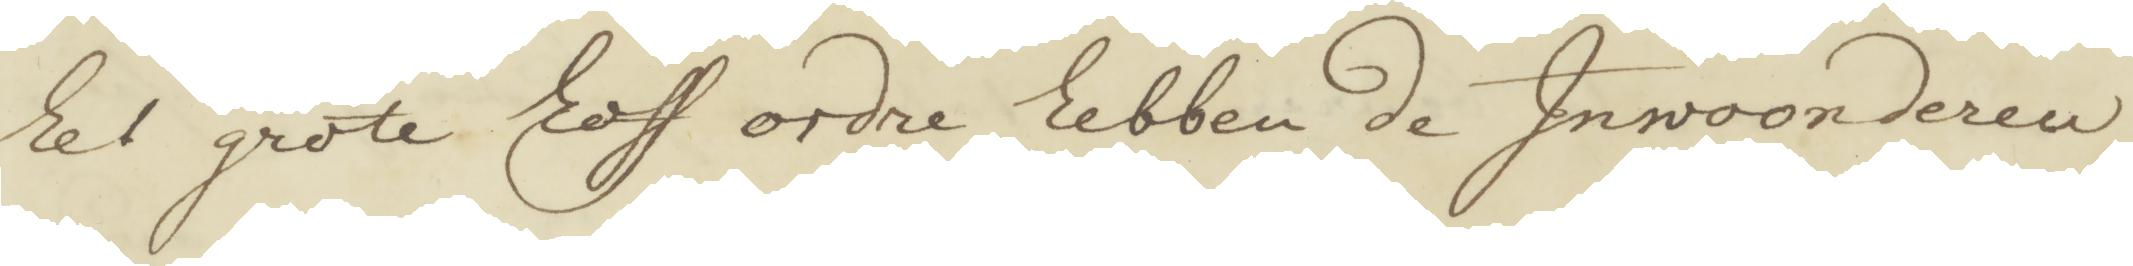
het grote hoff ordre hebben de Jnwoonderen
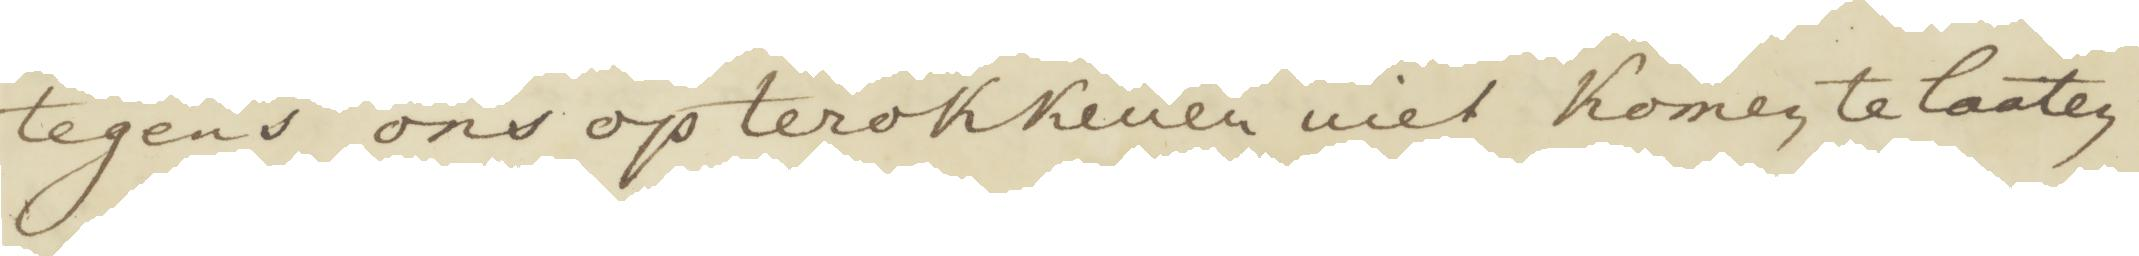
tegens ons op terokkenen niet komen te laaten
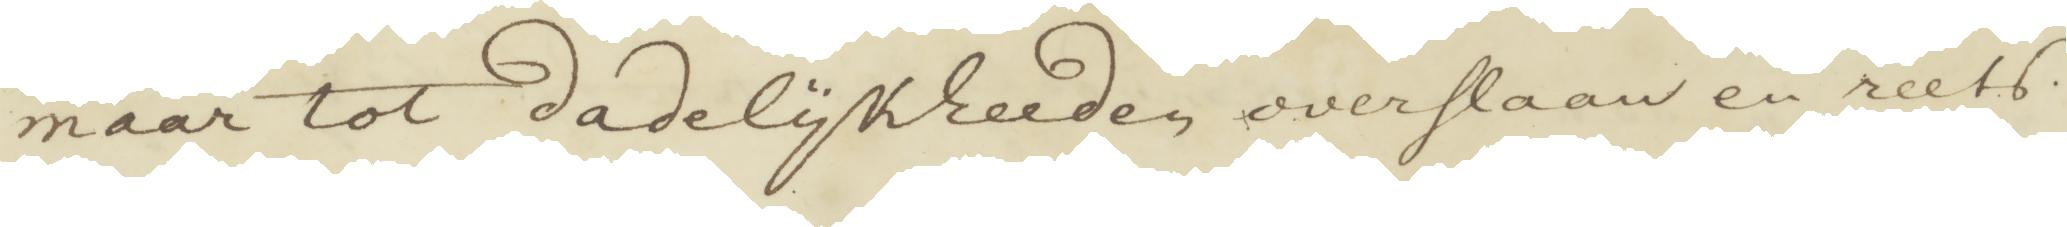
maar tot dadelijkheeden overslaan en reets.
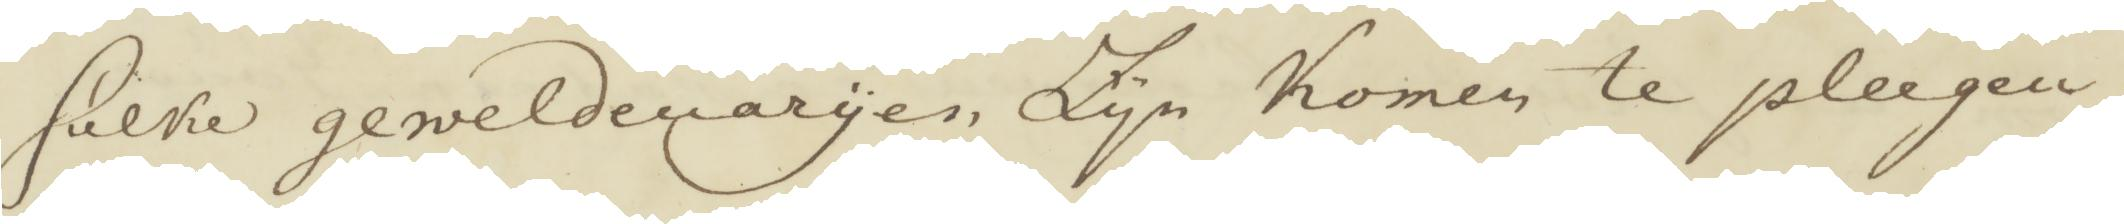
sulke geweldenarijen zijn Komen te pleegen
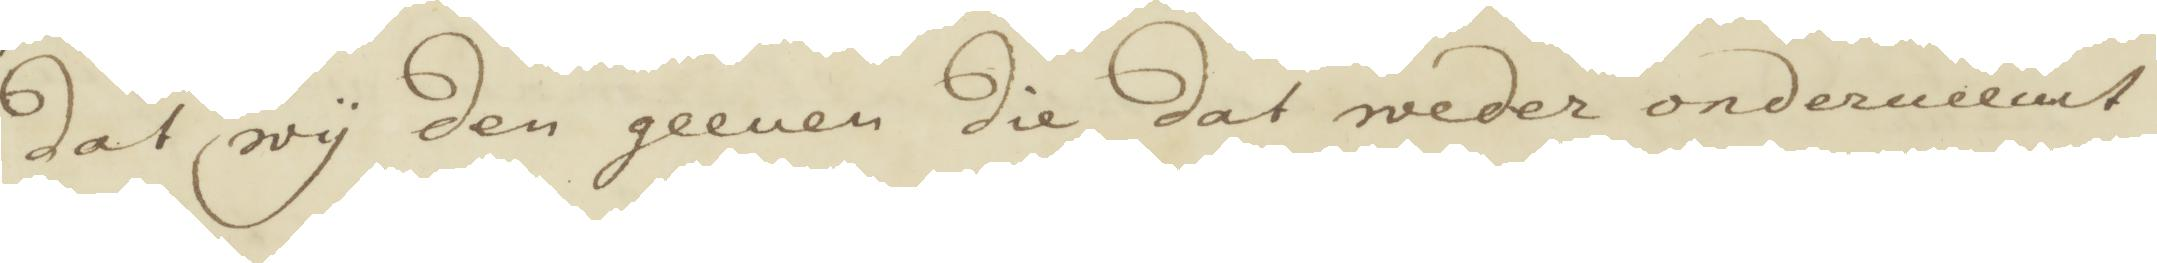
dat wij den geenen die dat weder onderneemt
